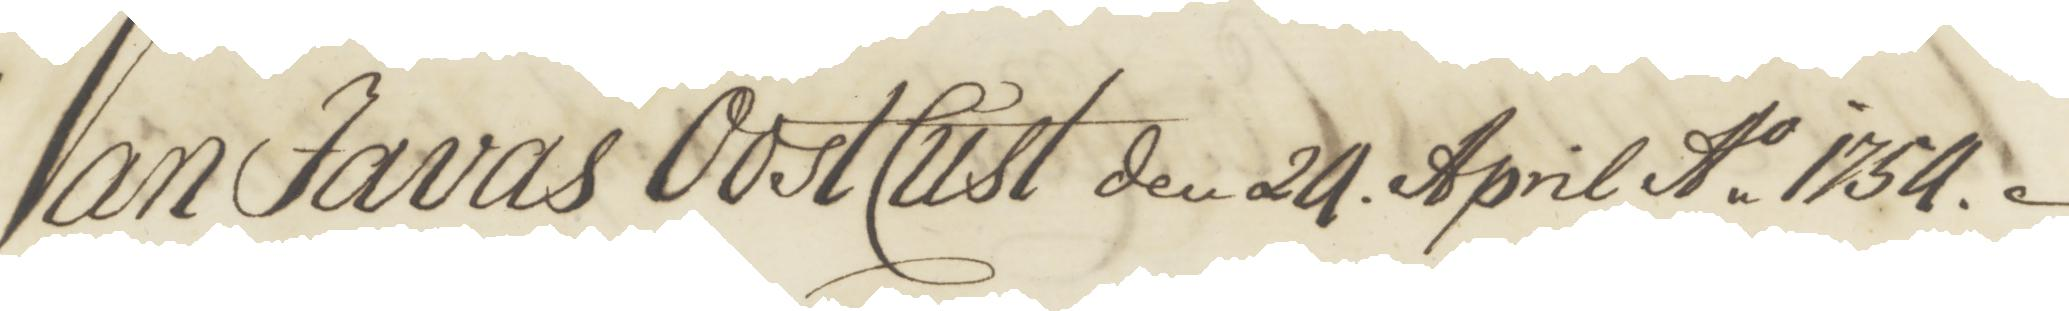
Van Javas Oost Cust den 24. April A„o 1754. —
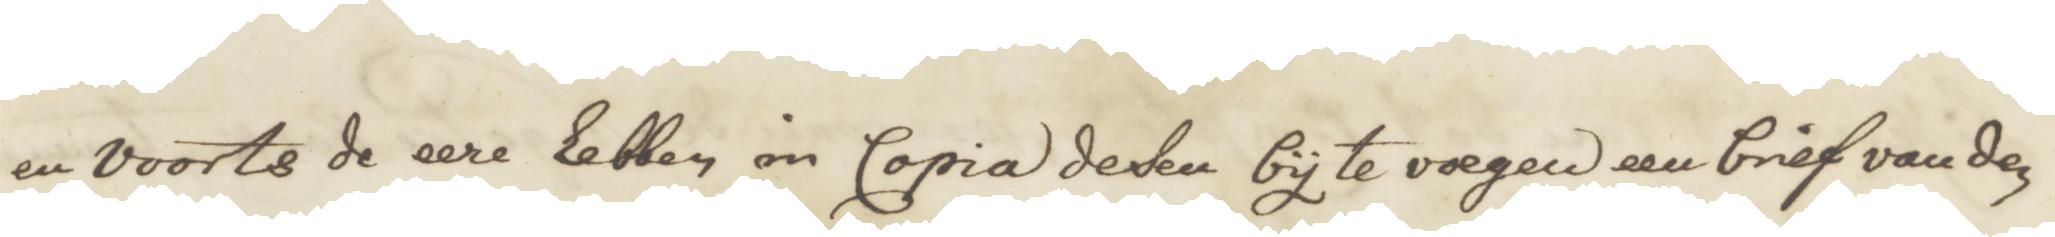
en voorts de eere hebben in Copia desen bij te voegen een brief van den
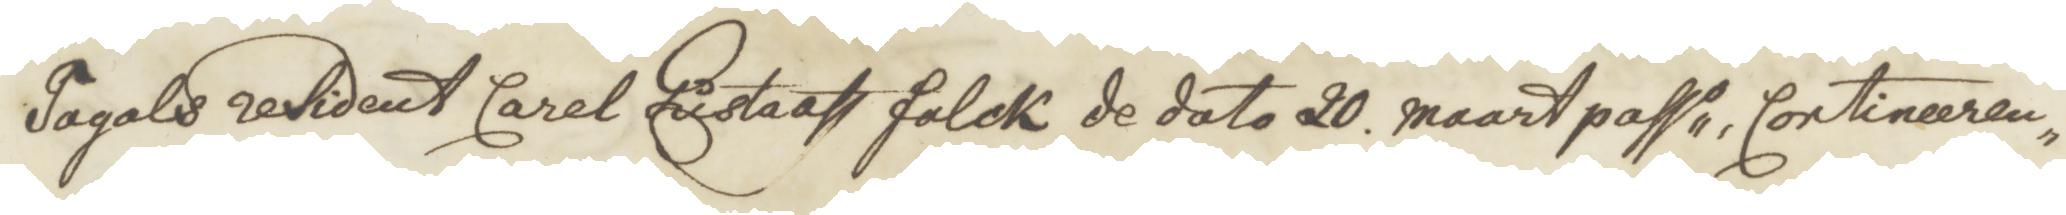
Tagals resident Carel Gustaaff folck de dato 20. maart pass„o, Cortineeren„
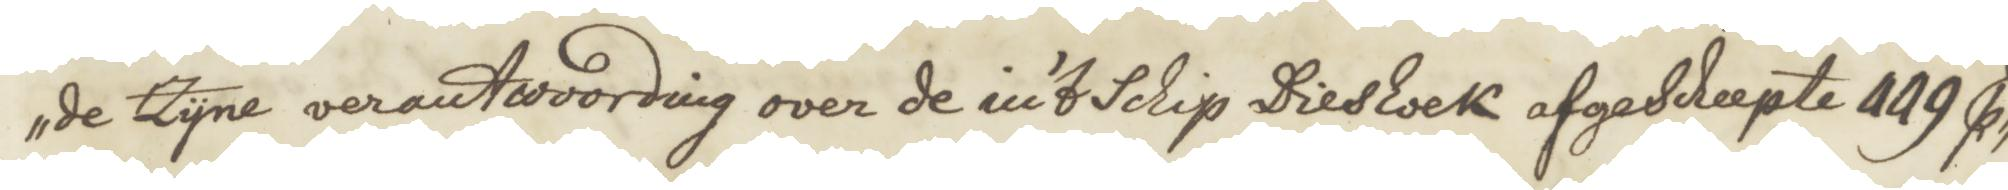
„de zijne verantwoording over de in't schip Dieshoek afgescheepte 449 p„s
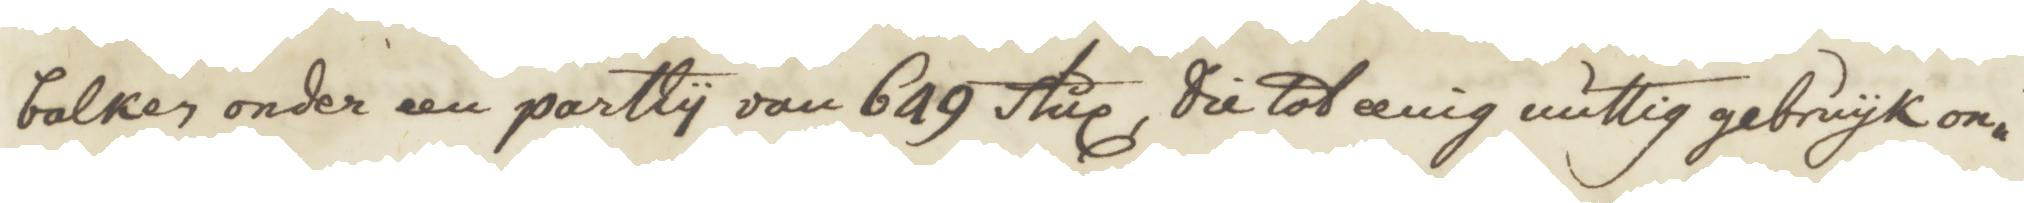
balken onder een parthij van 649 stux, die tot eenig nuttig gebruijk on„
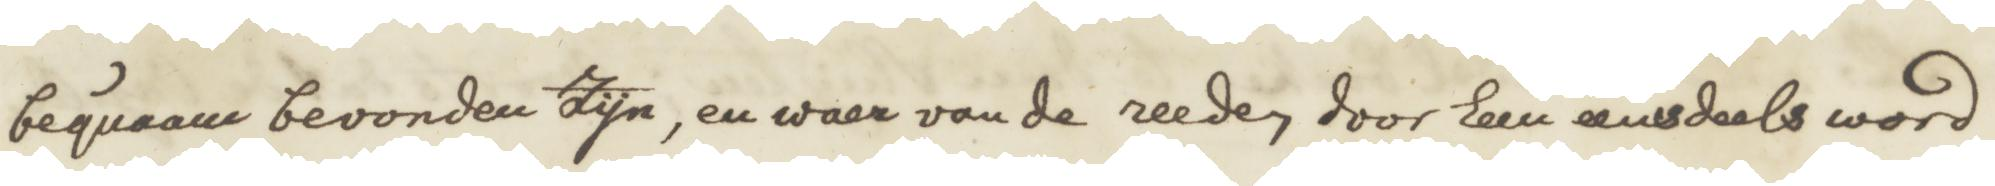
bequaam bevonden zijn, en waer van de reeden door heen eensdeels word
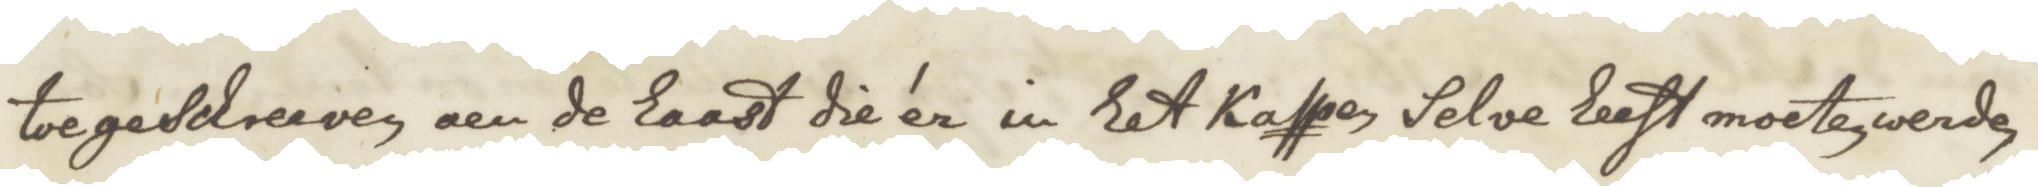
toe geschreeven aen de haast die 'er in het kappen selve heeft moeten werden
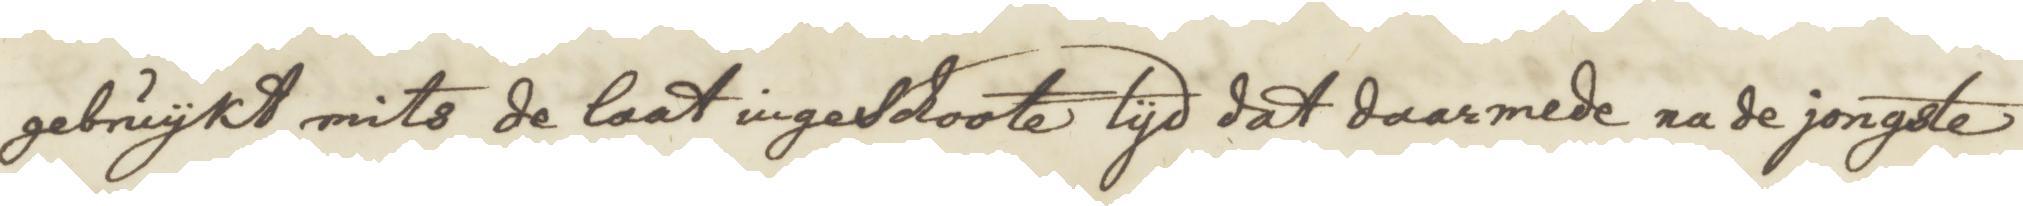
gebruijkt mits de laat ingeschoote tijd dat daarmede na de jongste
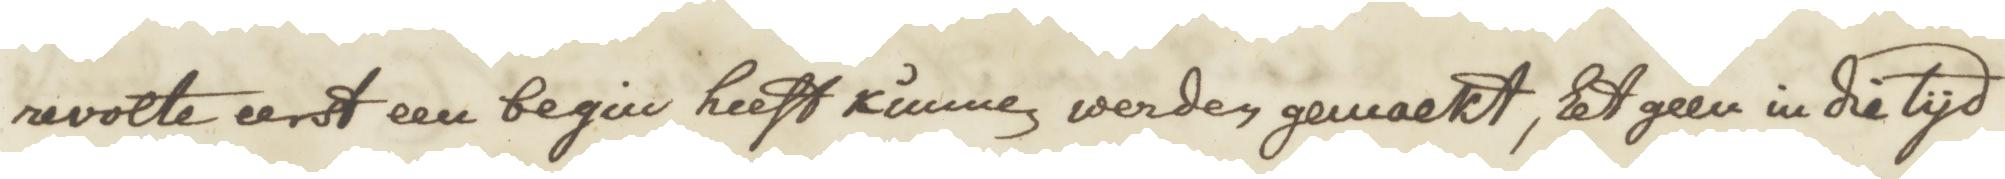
revolte eerst een begin heeft kunnen werden gemaekt, het geen in die tijd
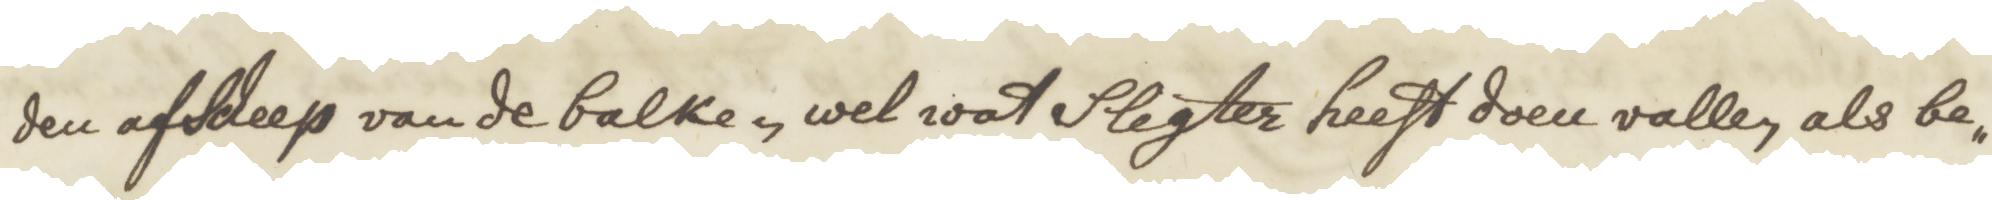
den afscheep van de balken wel wat slegter heeft doen vallen als be„
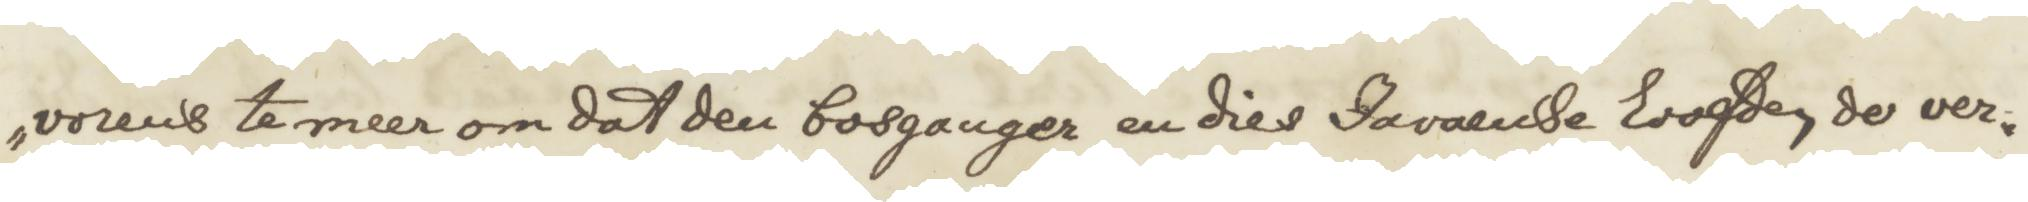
„vorens te meer om dat den bosganger en dies Javaense hoofden de ver„
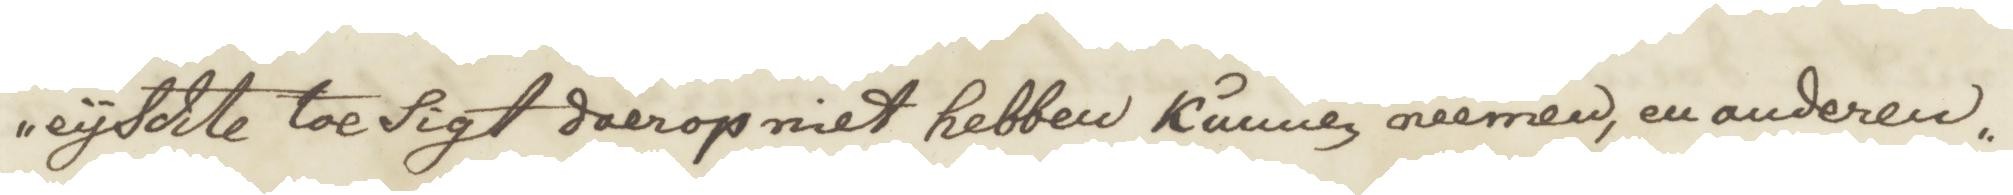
„eijschte toe sigt daer op niet hebben kunnen neemen, en anderen„
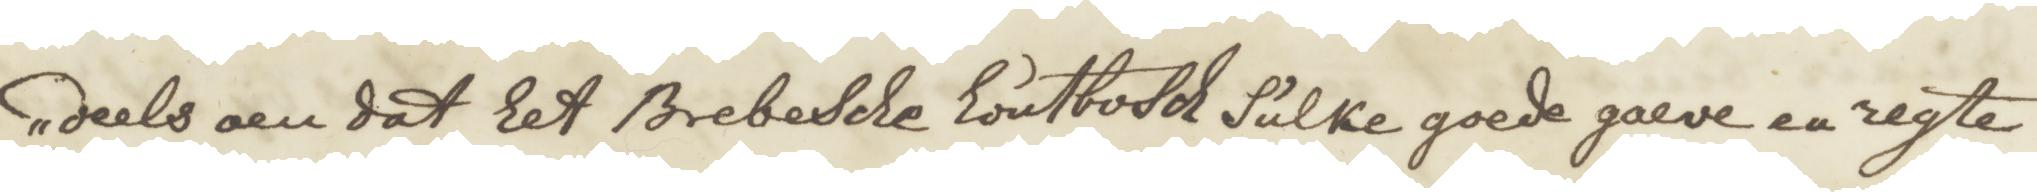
„deels aen dat het Brebesche houtbosch sulke goede gaeve en regte
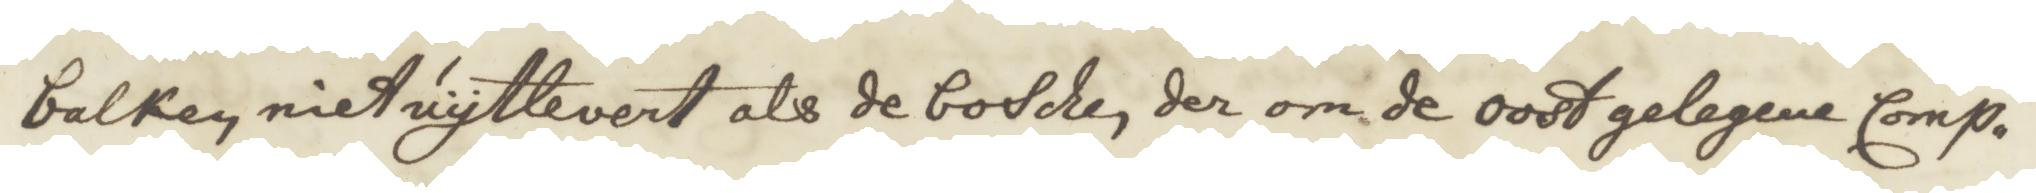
balken niet uijtlevert als de boschen der om de oost gelegene Comp„
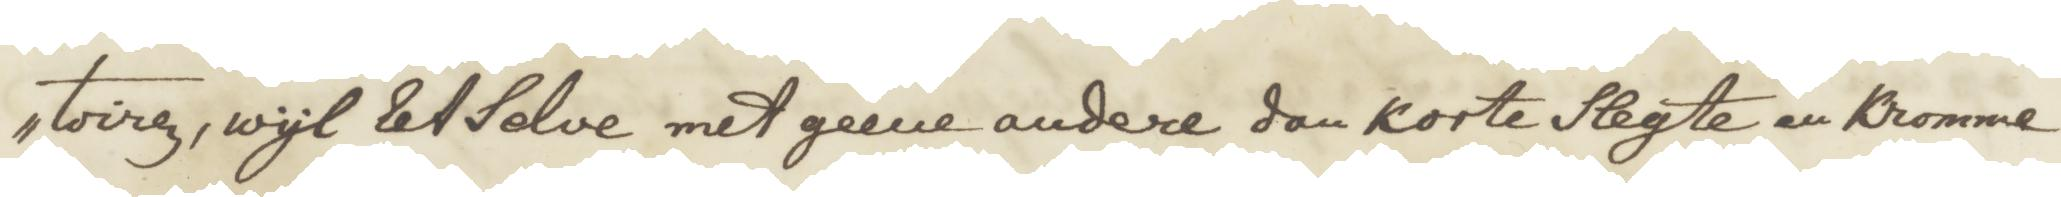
„toiren, wijl het selve met geene andere dan korte slegte en kromme
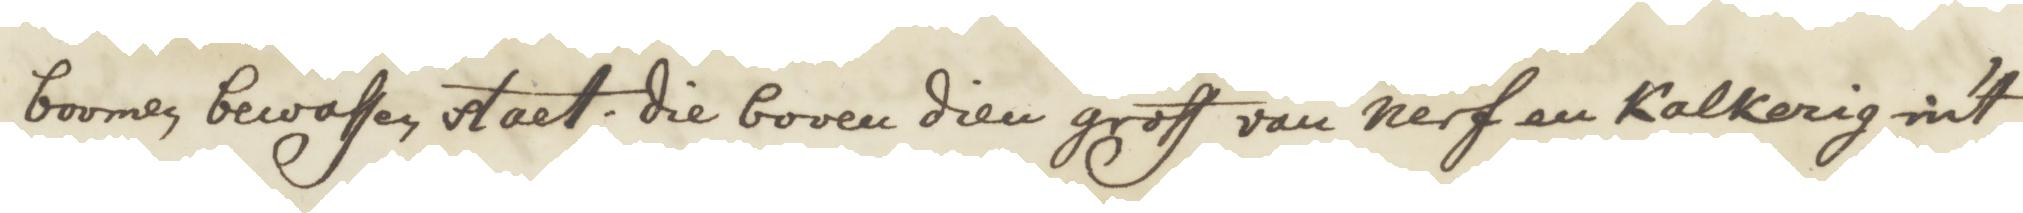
boomen bewassen staet, die boven dien groff van nerf en kalkerig in’t
